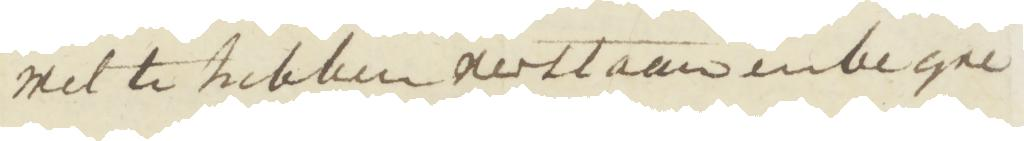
wel te hebben verstaan en begre
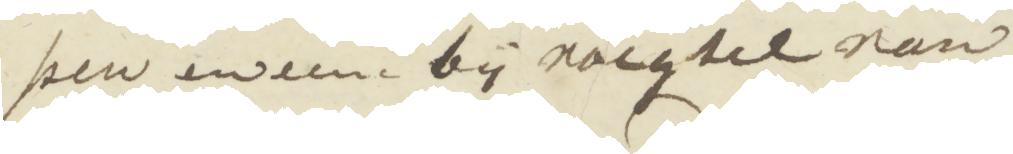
pen, en eene bij voegsel van
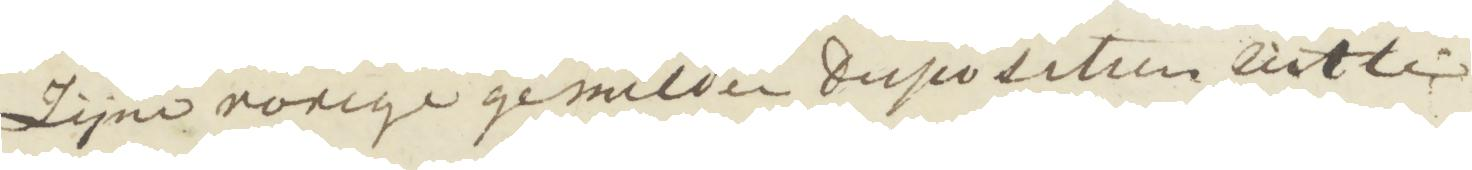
zijne vorige gemelden dispositien uitte
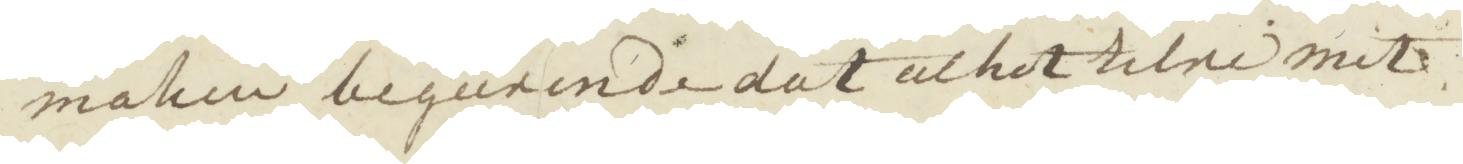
maken, begeerende dat al het zelve mit
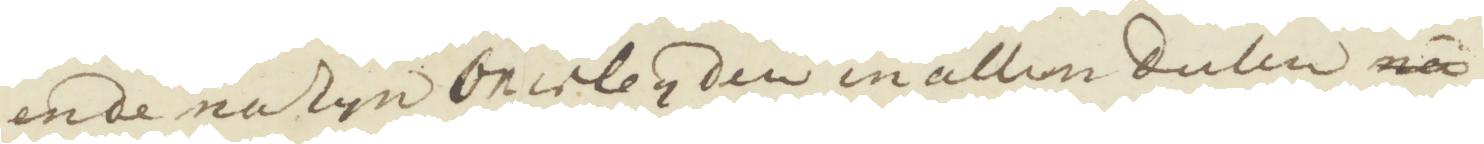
ende na zyn overleyden in allen deelen na
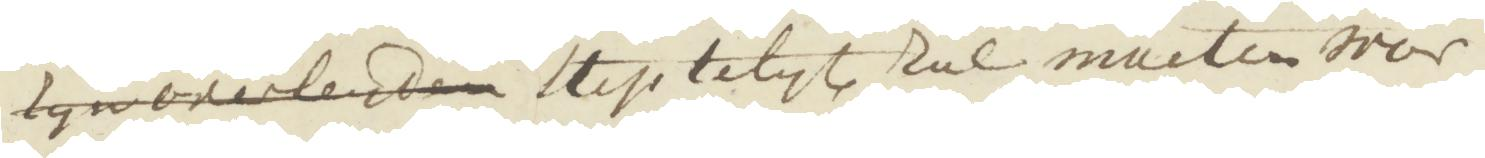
zyn overleyden stiptelyk zal moeten wor
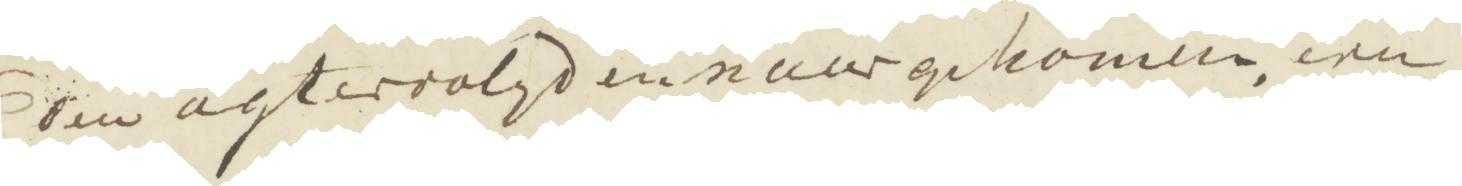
den agtervolgd en naar gekomen, even
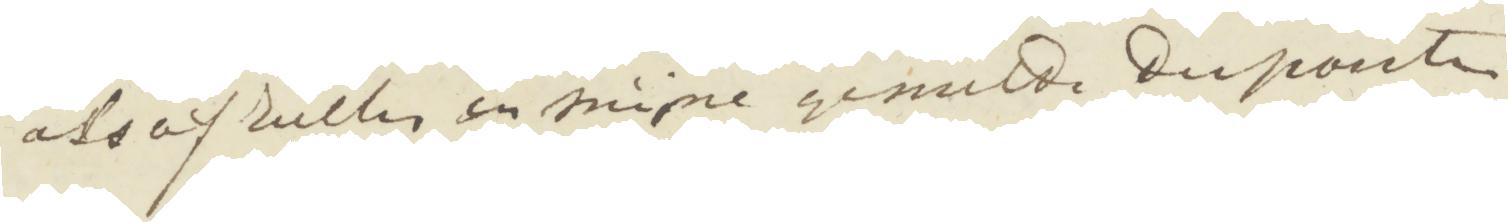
als of zullen in mijne gemelde dispositie
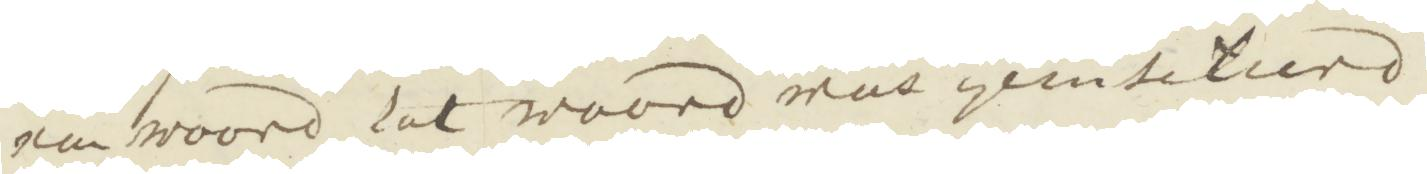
van woord tot woord was geinsereerd
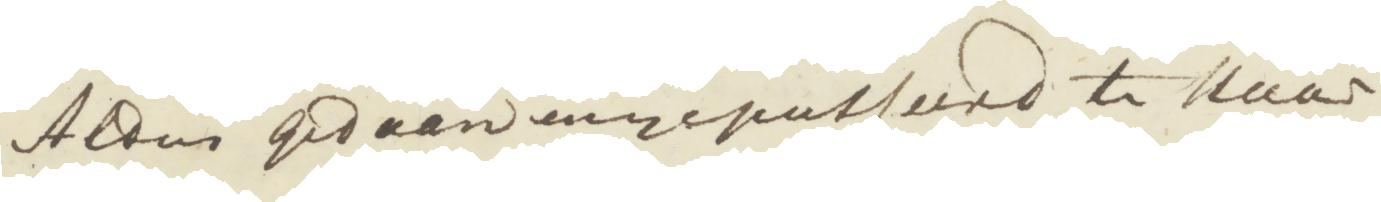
Aldus gedaan en gepasseerd te Haar
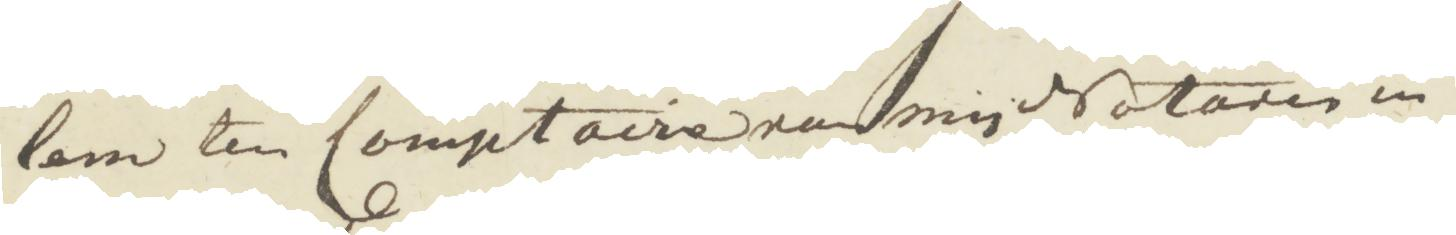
lem ten Comptoire van mij Notaris in
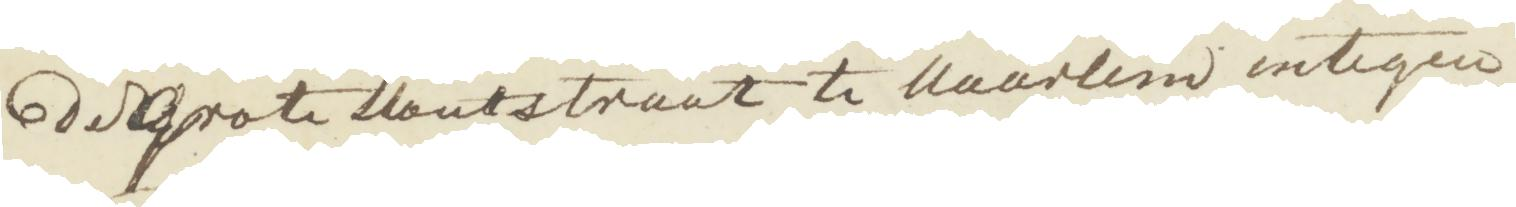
de Grote Houtstraat te Haarlem in tegen
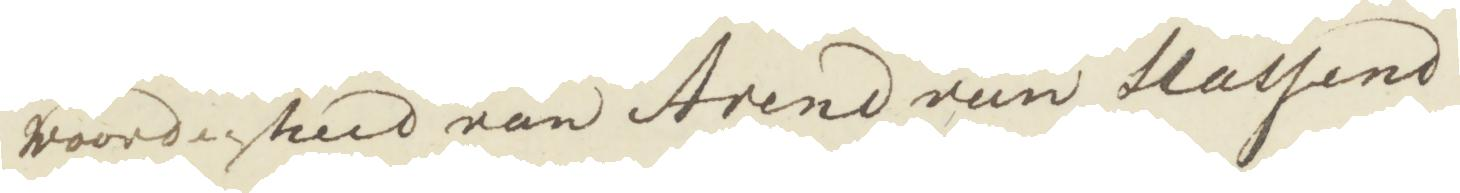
woordigheid van Arend van Hassend
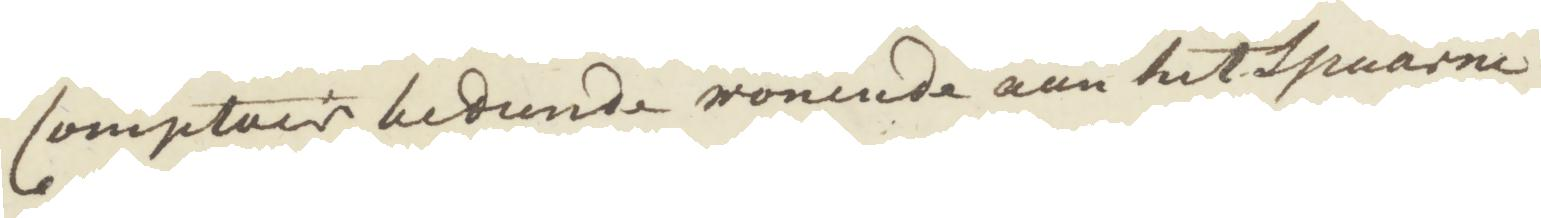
Comptoir bediende wonende aan het spaarne
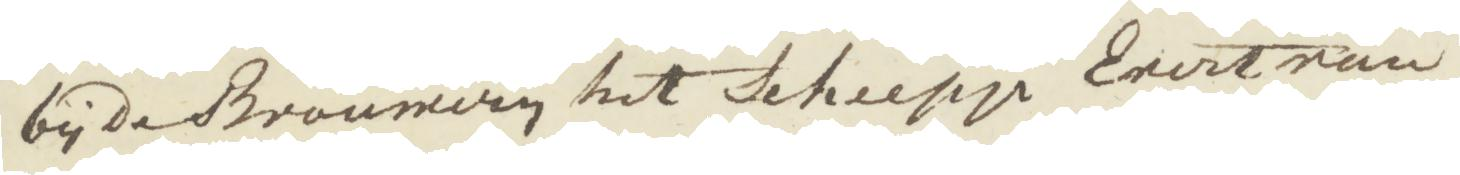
bij de Brouwery het scheepje Evert van
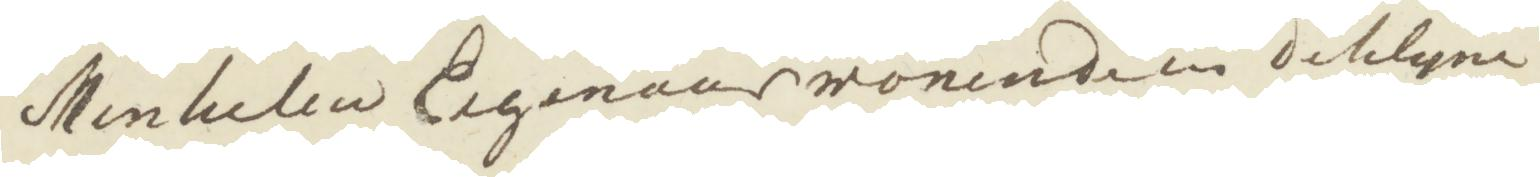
Minkelen Eigenaar wonende in de klyne
